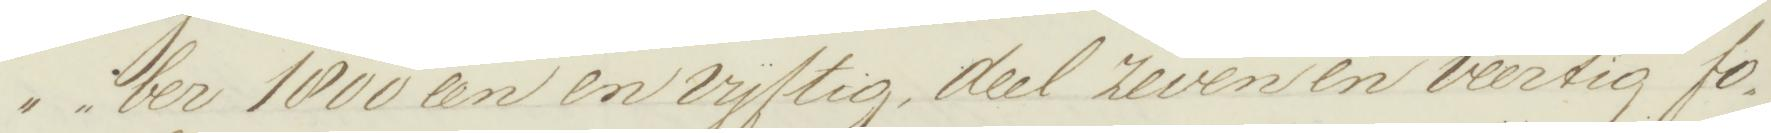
„ „ber 1800 een en vijftig, deel zeven en veertig fo„
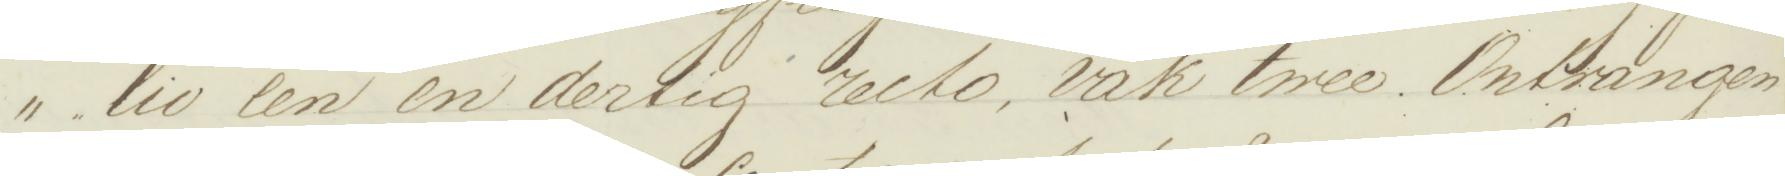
„ „lio een en dertig recto, vak twee. Ontvangen
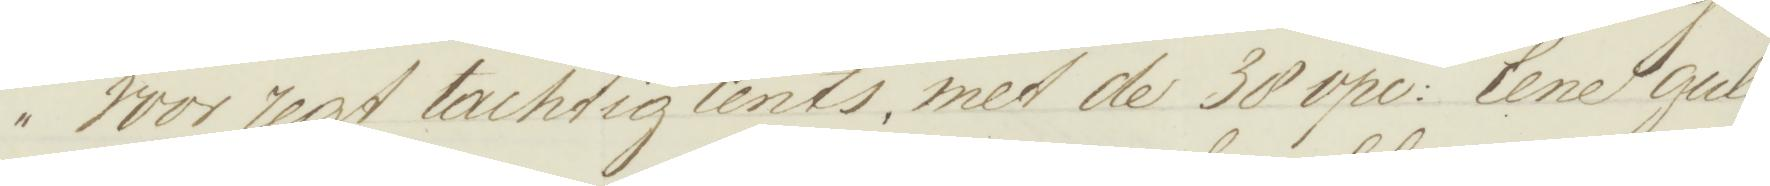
„ voor regt tachtig Cents, met de 38 opc: Eene gul
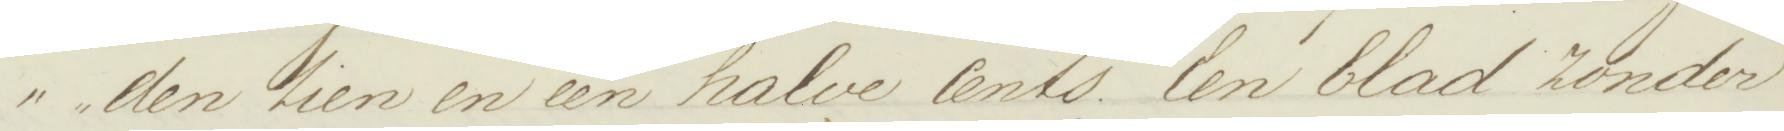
„ „den tien en een halve Cents. Een blad zonder
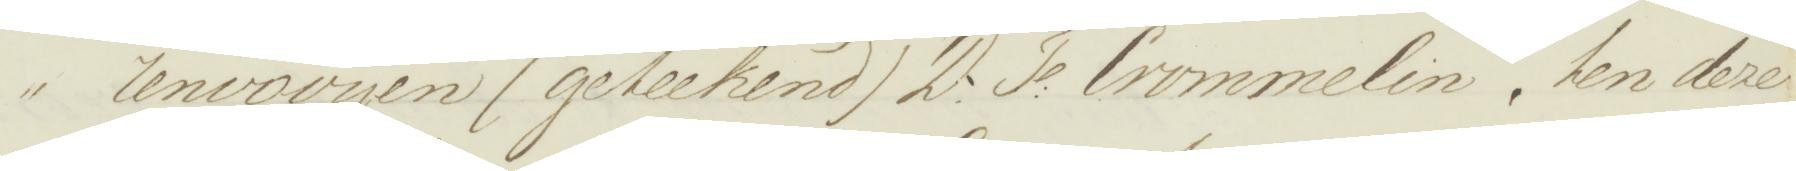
„ renvooijen (geteekend) D: F: Crommelin", ten deze
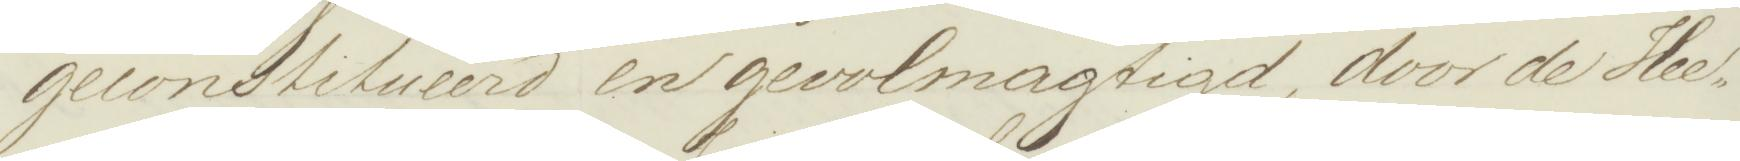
geconstitueerd en gevolmagtigd, door de Hee„
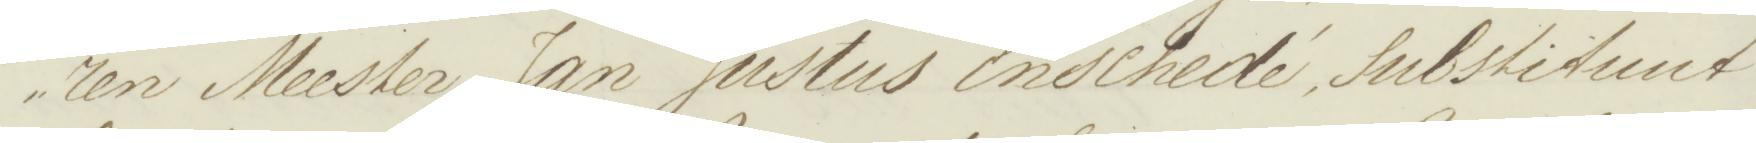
„ren Meester Jan Justus Enschedé, substituut
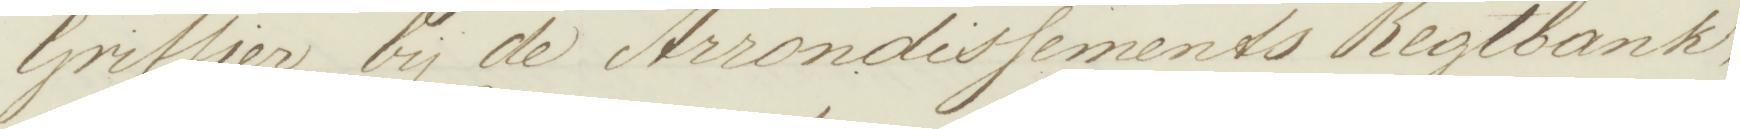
Griffier bij de Arrondissements Regtbank
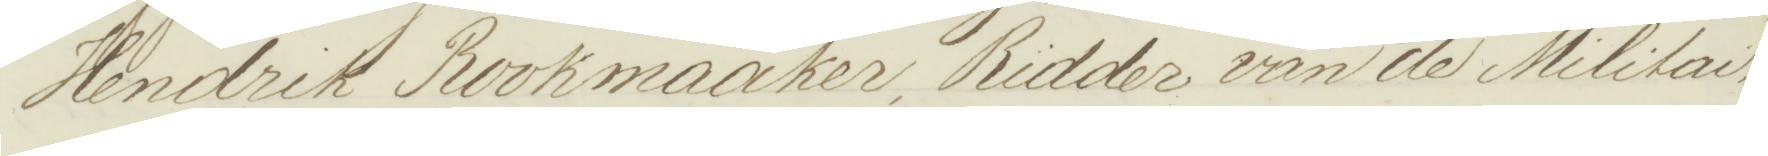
Hendrik Rookmaaker, Ridder van de Militai„
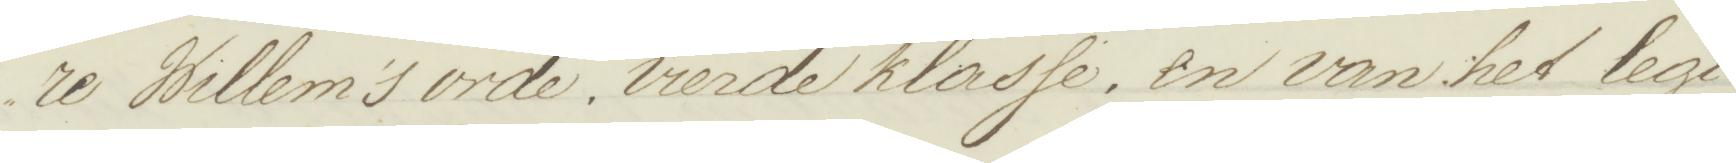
„re Willem's orde, vierde klasse, en van het legi
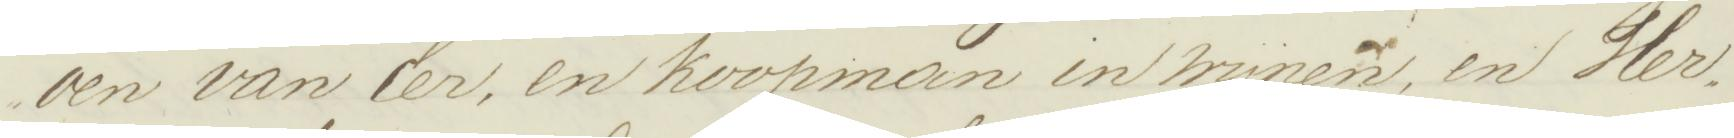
„oen van Eer, en koopman in wijnen, en Her„
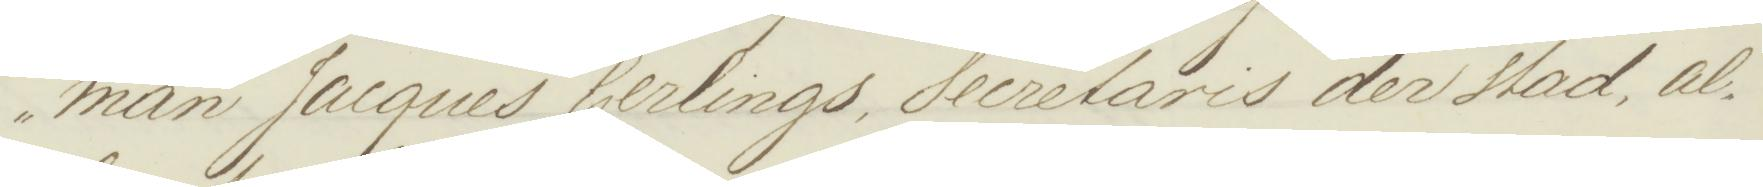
„man Jacques Gerlings, Secretaris der stad, al„
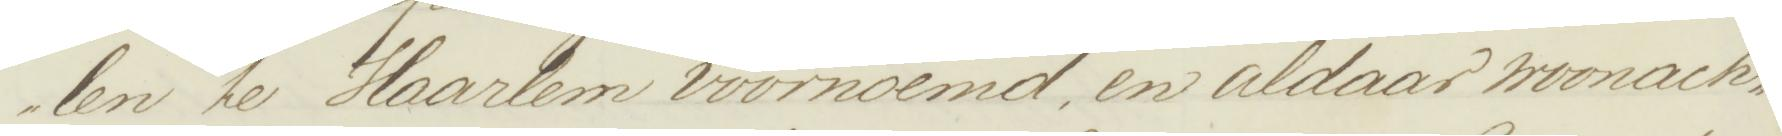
„len te Haarlem voornoemd, en aldaar woonach„
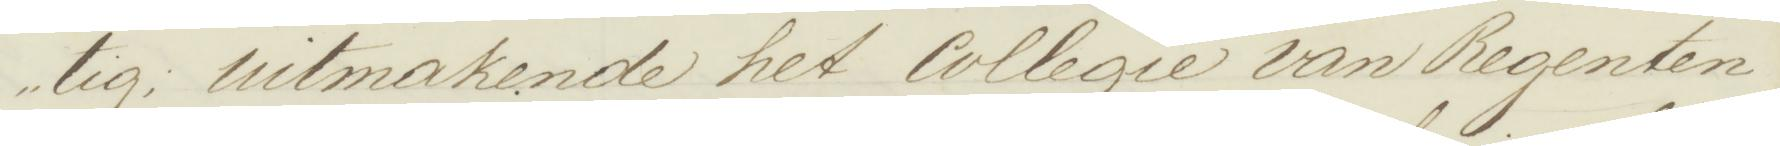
„tig; uitmakende het Collegie van Regenten
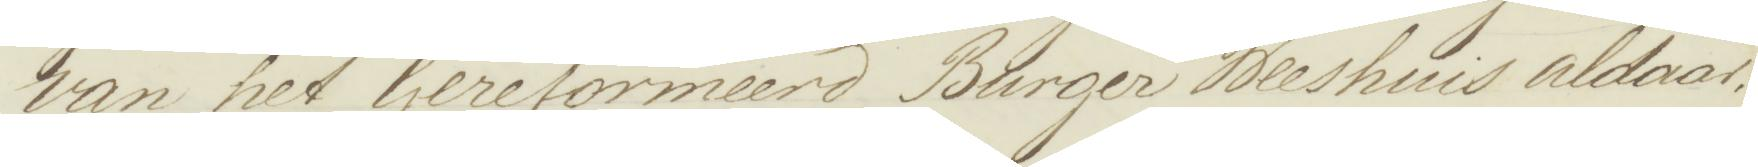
van het Gereformeerd Burger Weeshuis aldaar,
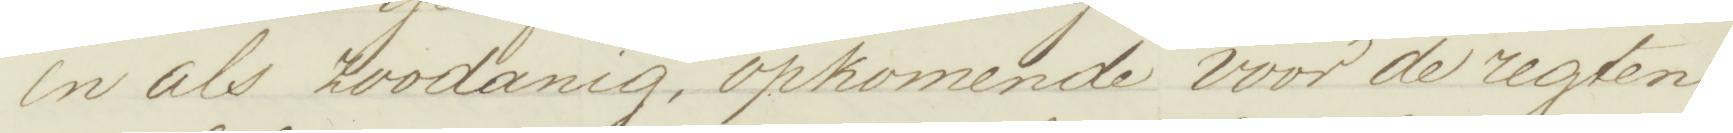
en als zoodanig, opkomende voor de regten
